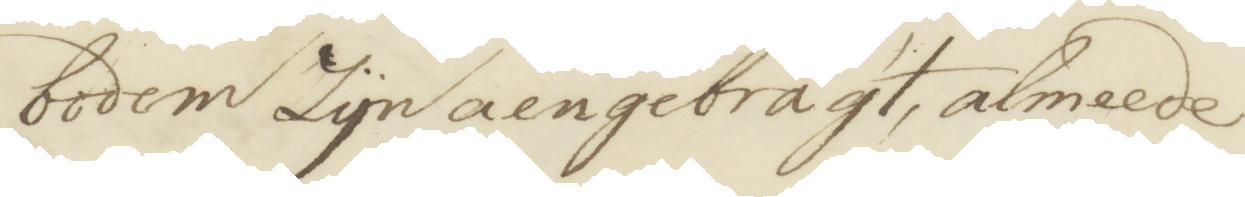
bodem zijn aengebragt, almeede
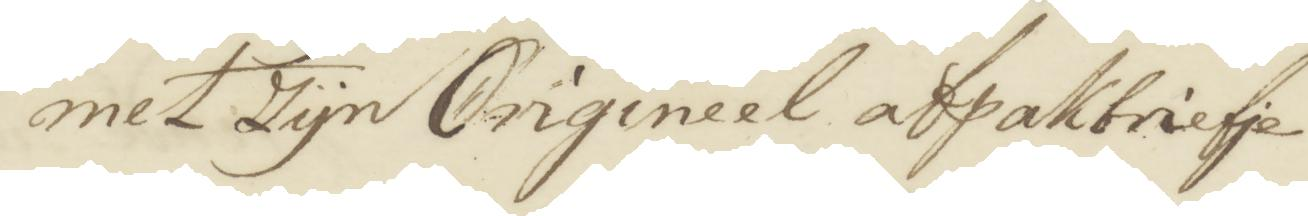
met zijn Origineel afpakbriefje
